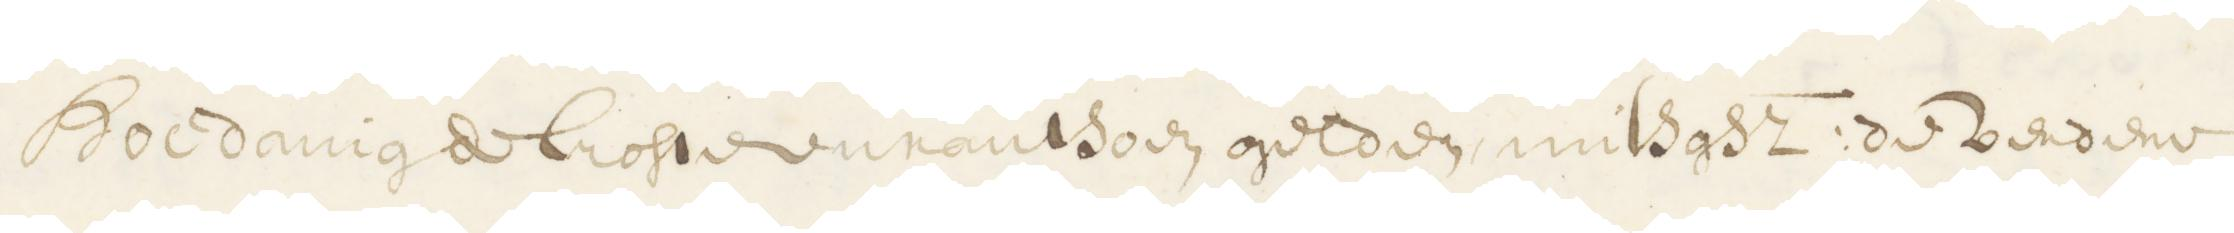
Hoedanig de koste en rantsoen gelden, mitsgsz: de verdere
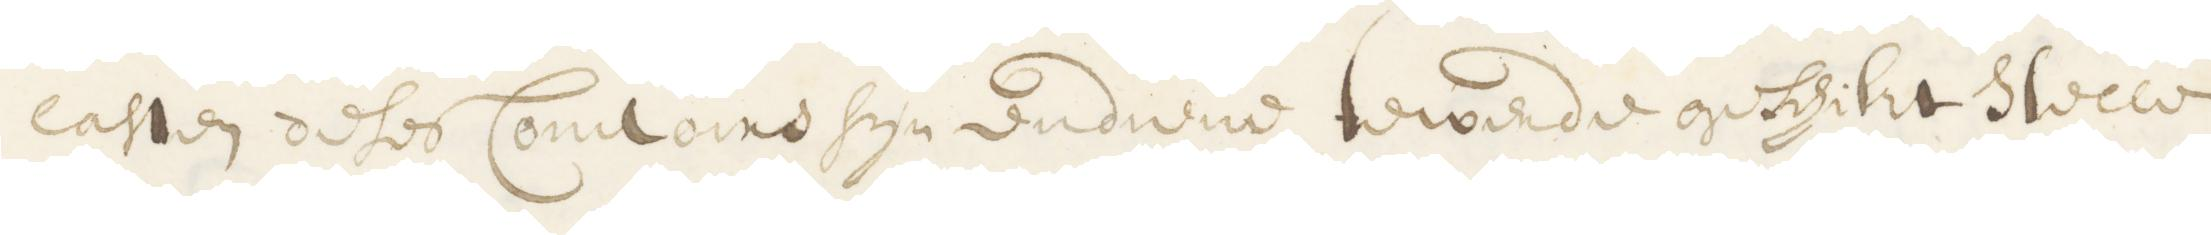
lasten deses Comtoirs sijn en diene te werde geschikt stelle
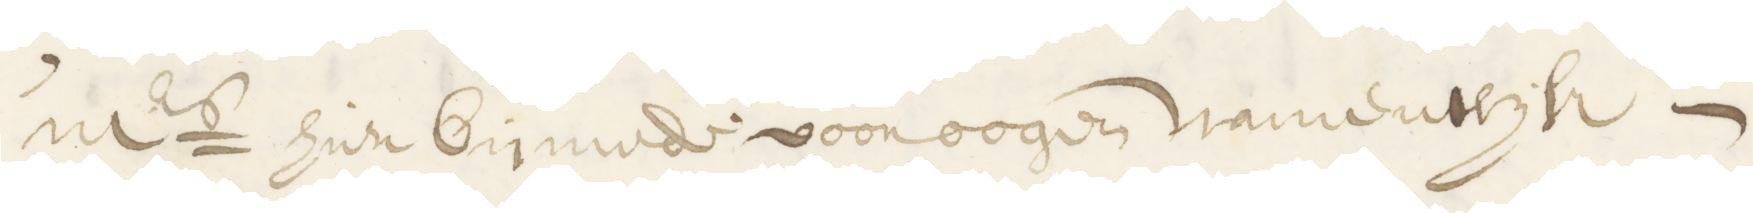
uE=s hier bij mede voor oogen namentlijk —
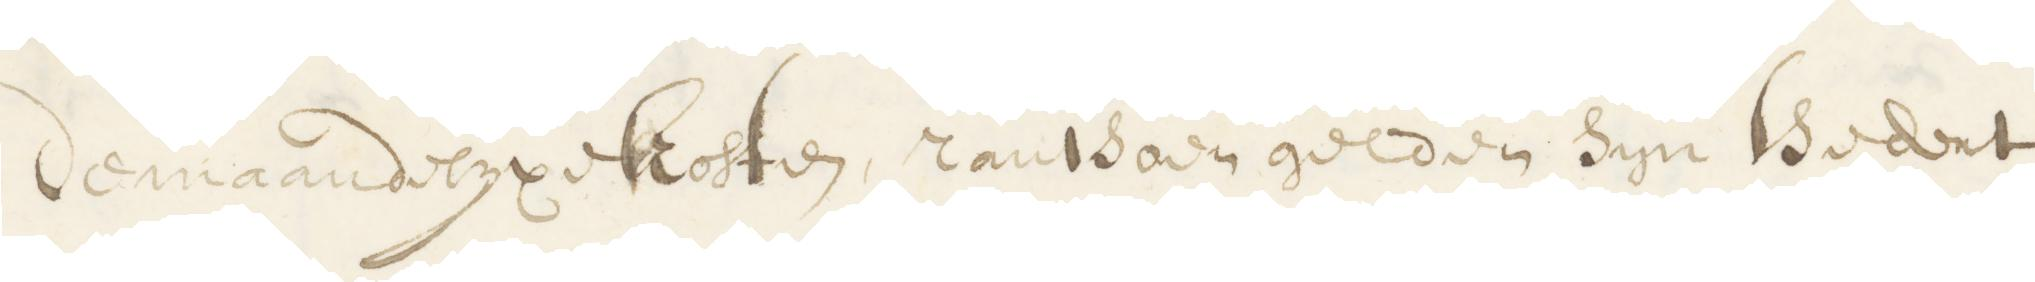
de maandelijxe kosten, rantsoen gelden sijn tsedert
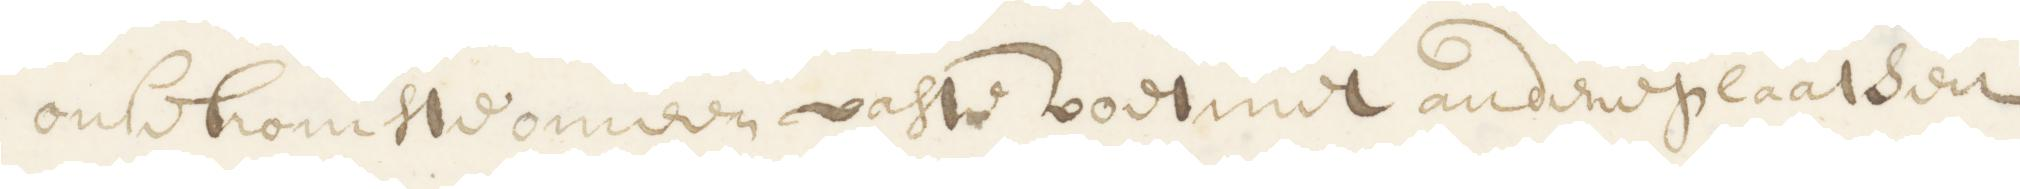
onse komste om een vaste voet met andere plaatsen
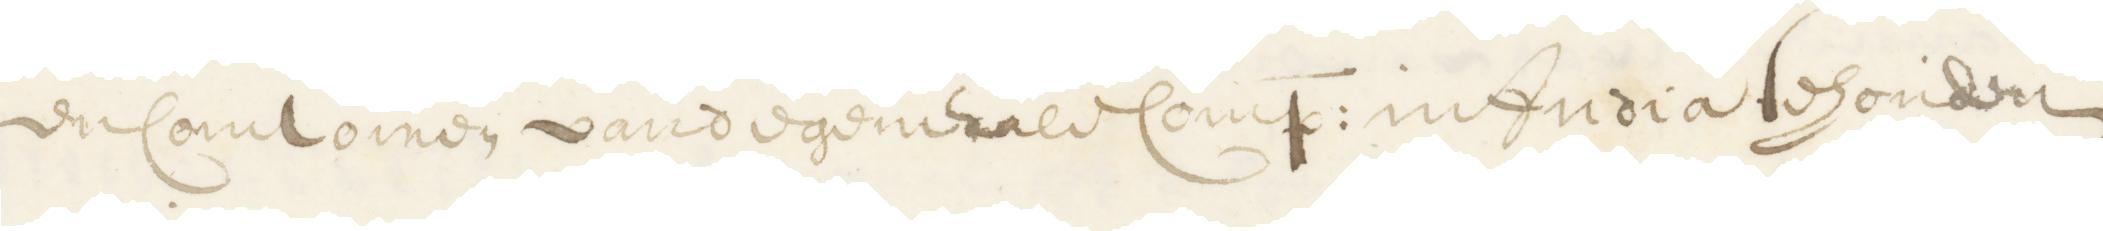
en Comtoiren van de generale Comp: in Jndia tehouden
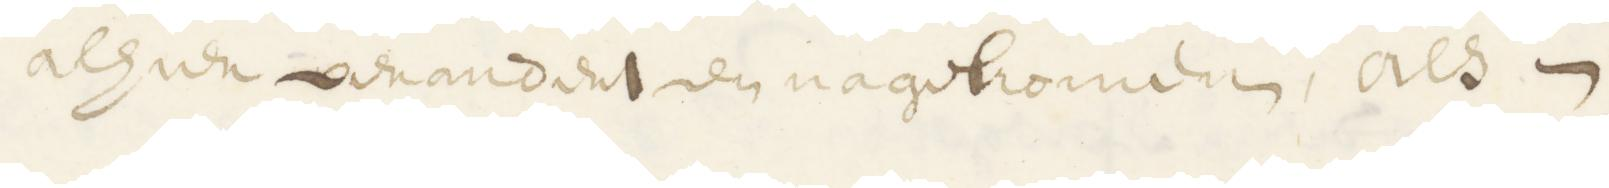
alhier verandert en nagekomen, als —
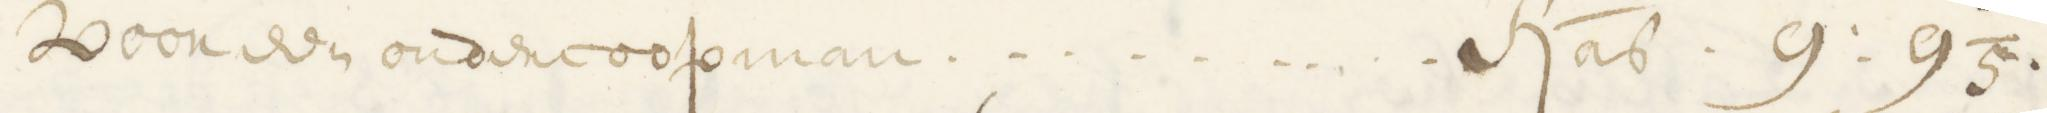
voor een ondercoopman - - - - - - - - - R o/as. 9: 9 3/5.
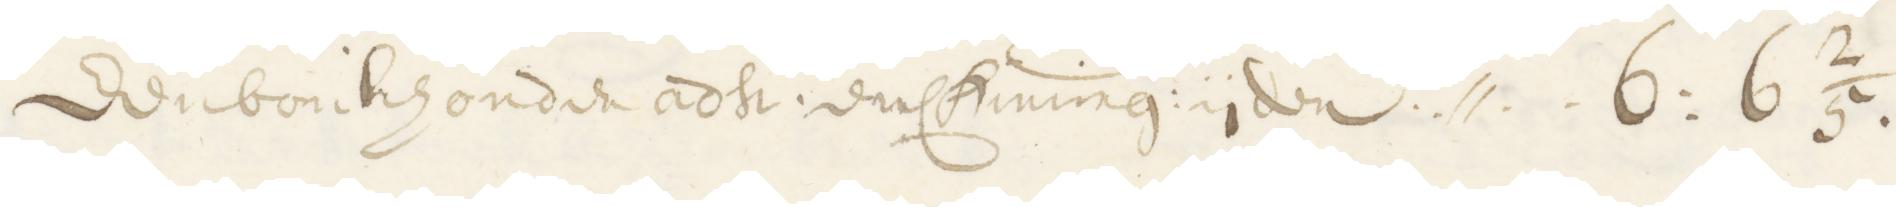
Een boukhouder adsi:t en Chirurg: ijder. „ - - 6: 6 2/5.
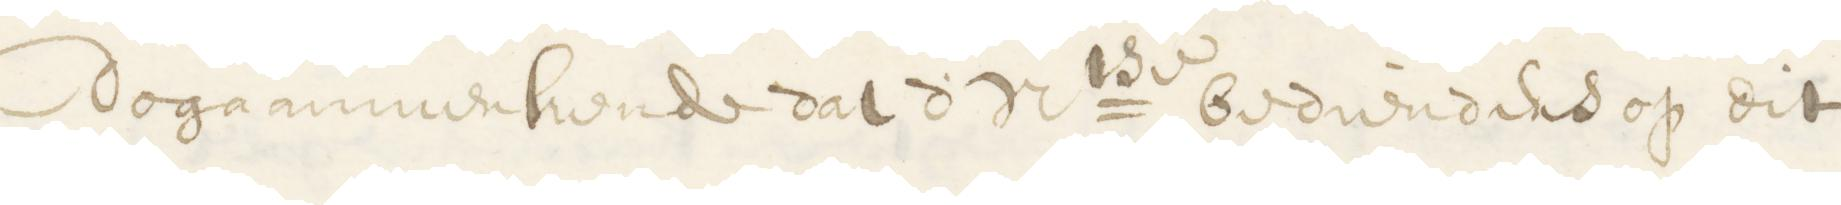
dog aanmerkende dat d’ N=tse bedienders op dit
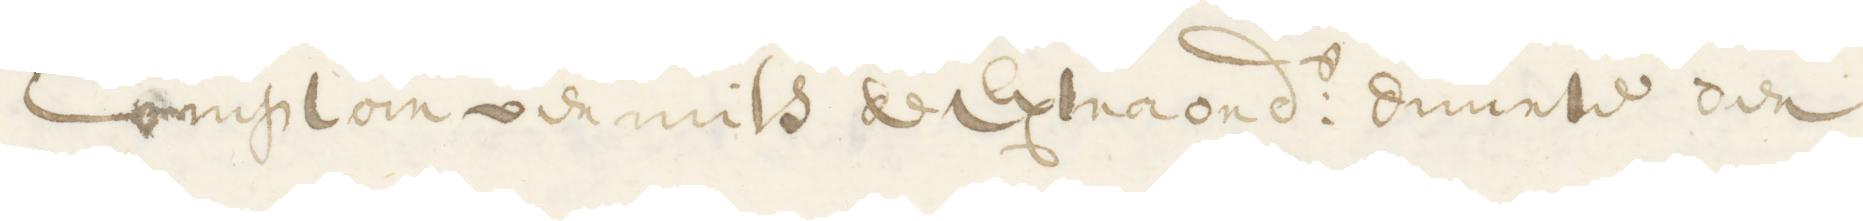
Comptoir vermits de Extraord:s duurte der
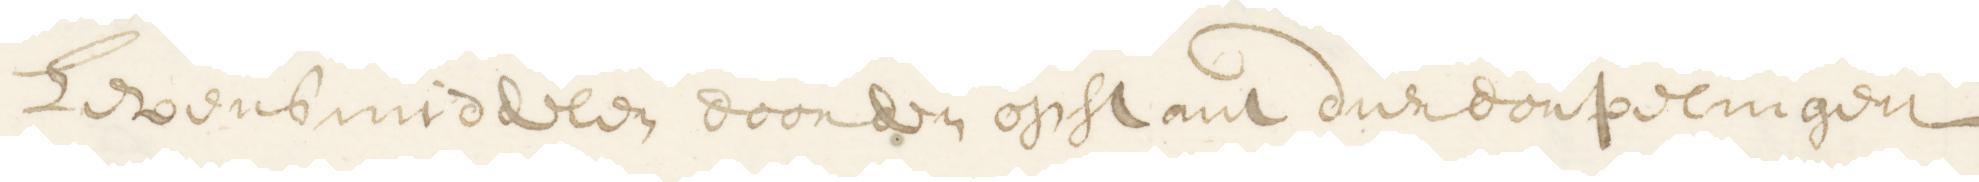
levensmiddelen door den opstant dier dorpelingen
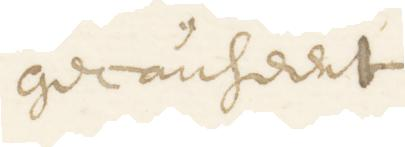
gecauseert
